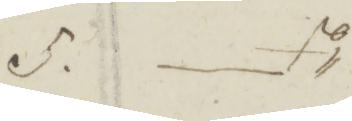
5. _„o
